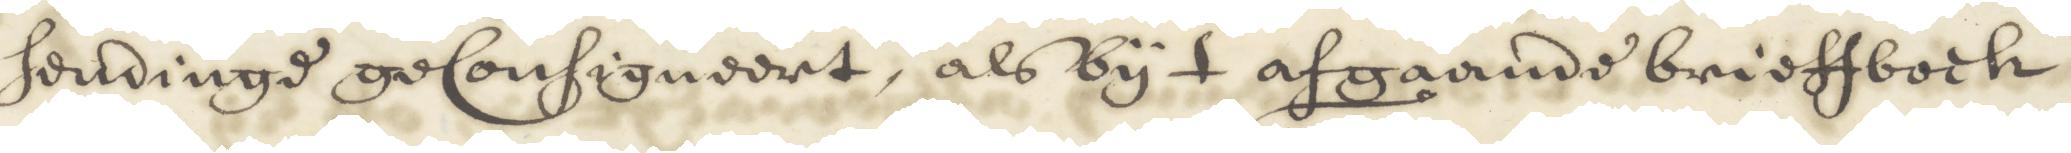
sendinge geconsigneert, als bij ’t afgaande brieffbock
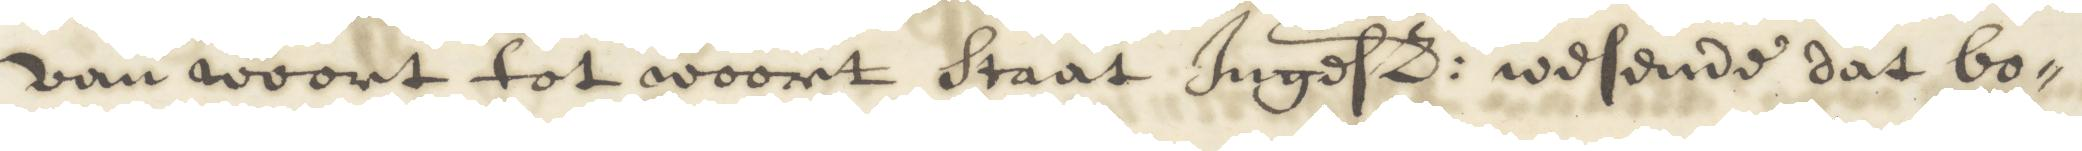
van woort tot woort staat Ingesz: wesende dat bo„
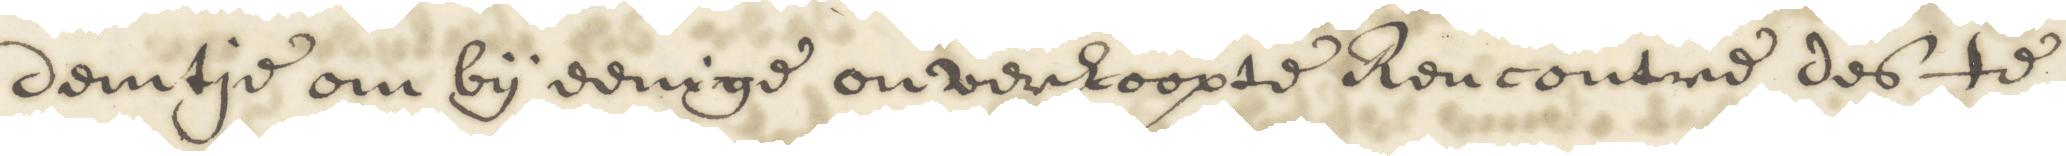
demtje om bij eenige onverhoopte Rencontre des te
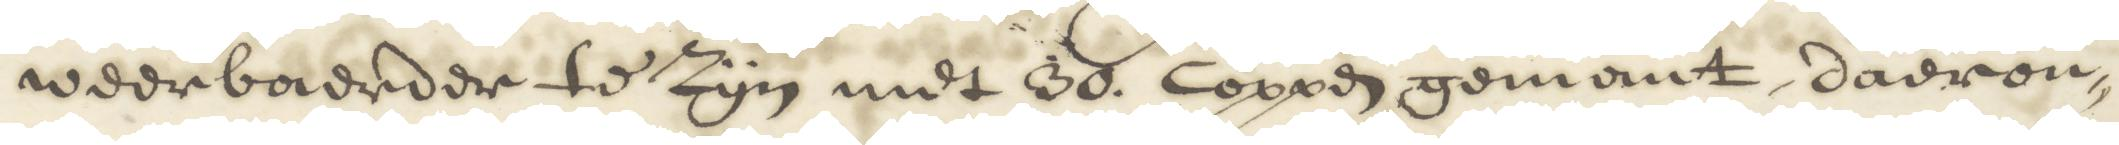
weerbaerder te zijn met 30. coppen gemant, daeron„
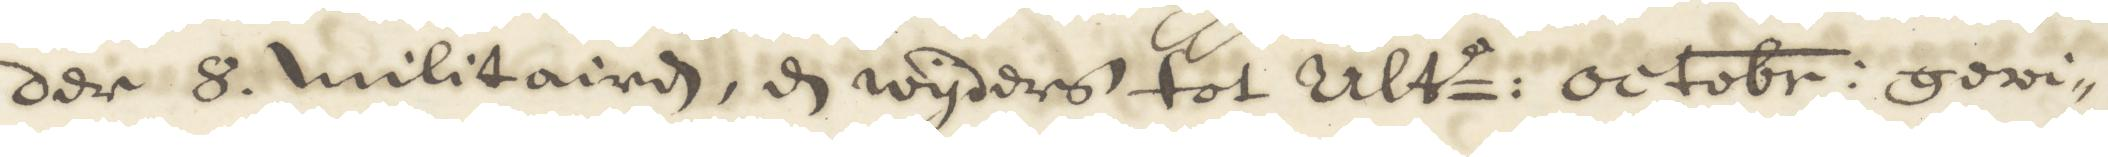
der 8. militairen, en wijders tot Ult=o: octobr: gevi„
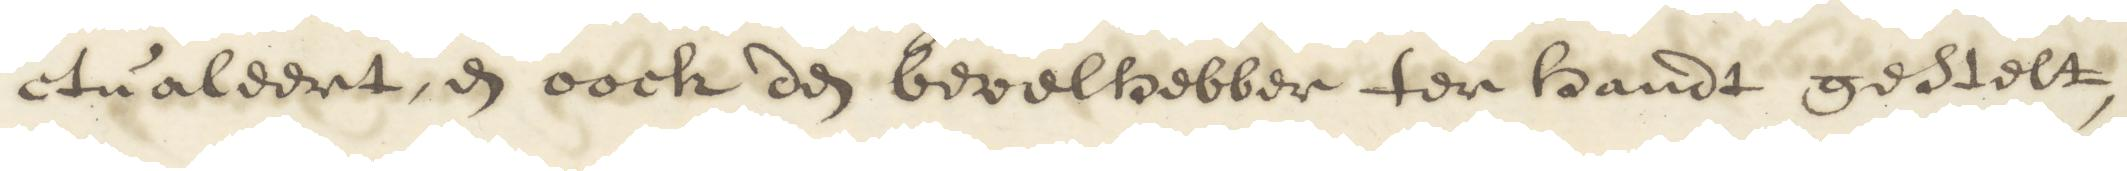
ctualeert, en oock den bevelhebber ter handt gestelt,
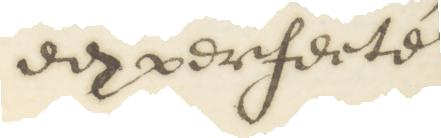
een perfecte
